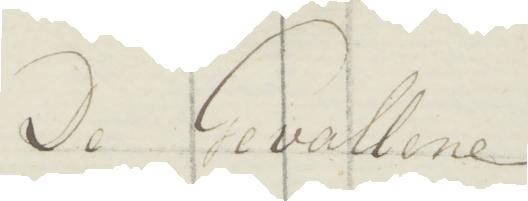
De Gevallene
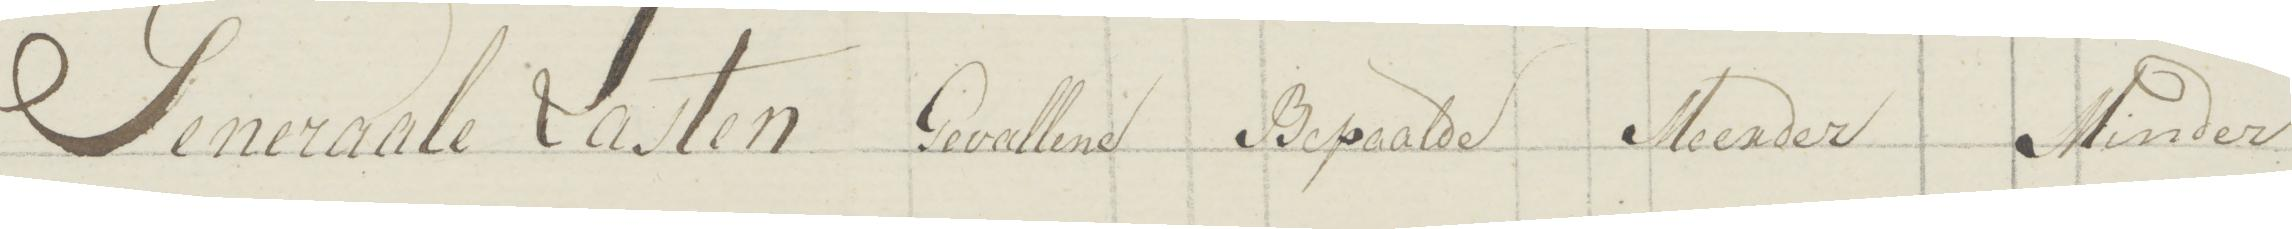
Generaale Lasten Gevallene Bepaalde Meerder Minder
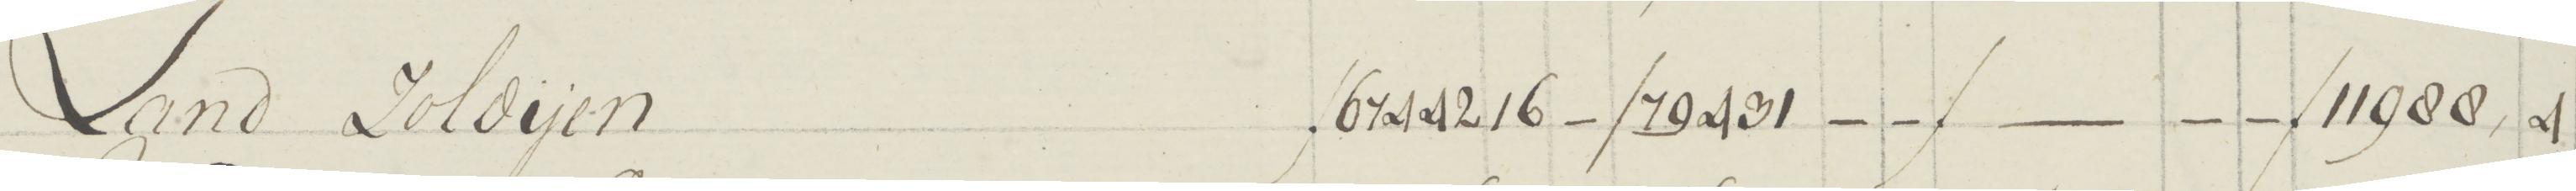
Land Zoldijen ƒ6744216 – ƒ79431 – – ƒ — – – ƒ11988, 4
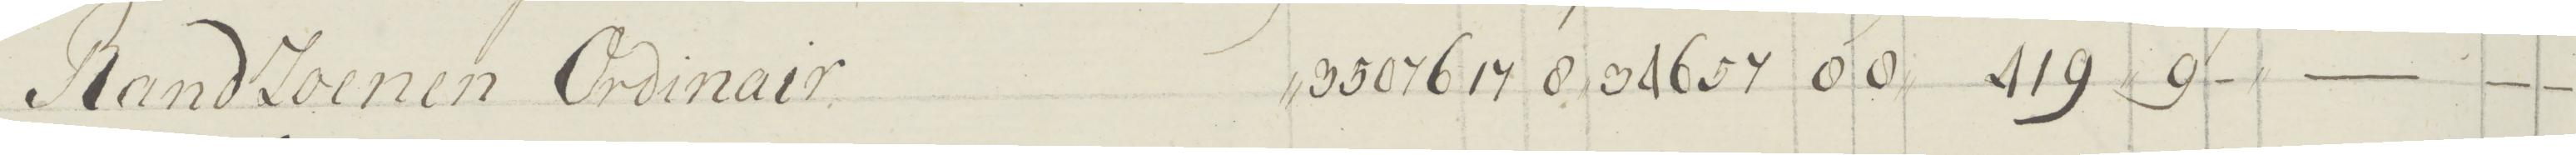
Randzoenen Ordinair „35076 17 8 „ 34657 8 8„ 419 „ 9 „ — – –
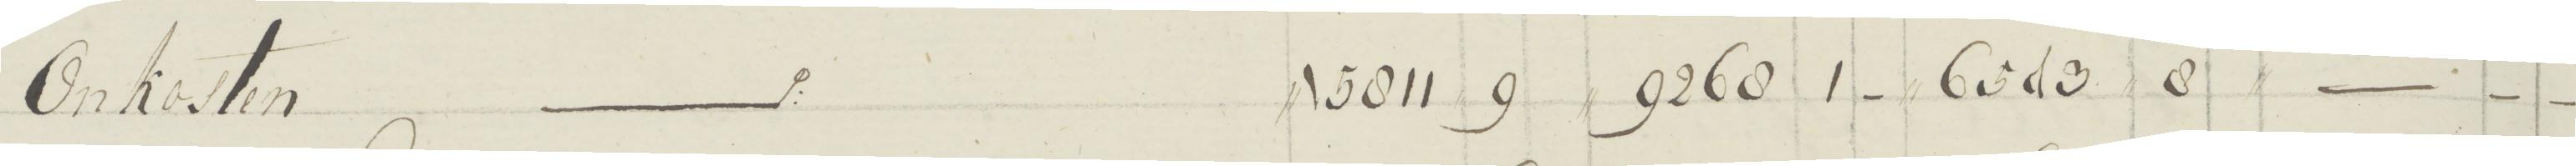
Onkosten _„o „15811 „ 9 „ 9268 1 - „ 6543 „ 8 „ — – –
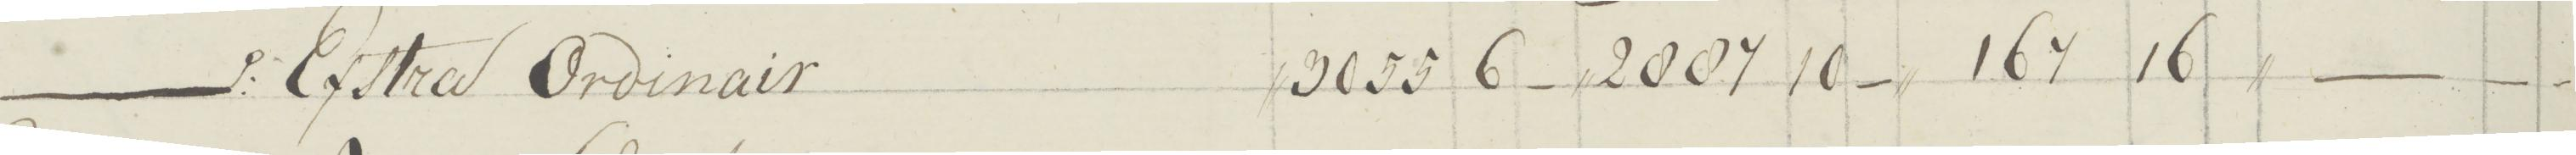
_:o Exstra Ordinair „3035 6 – „2887 10 –„ 167 16 „ — – –
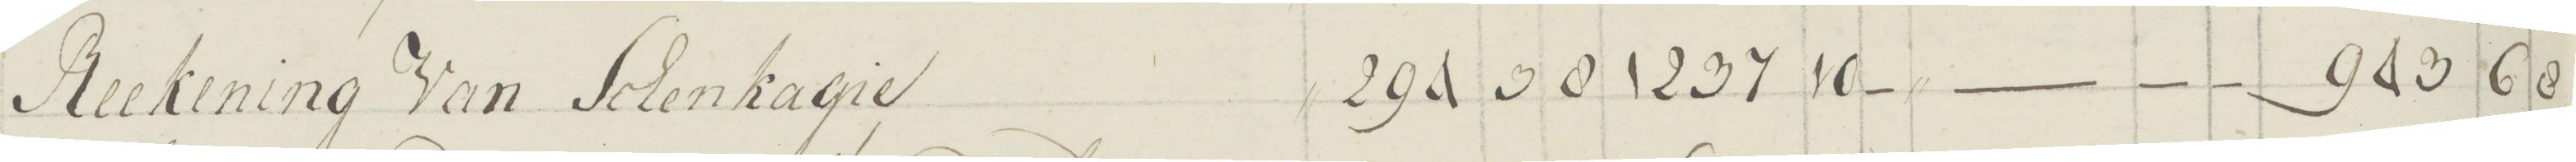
Reekening van Schenkagie „ 2943 8 1237 10 – „ — – – 943 6 8
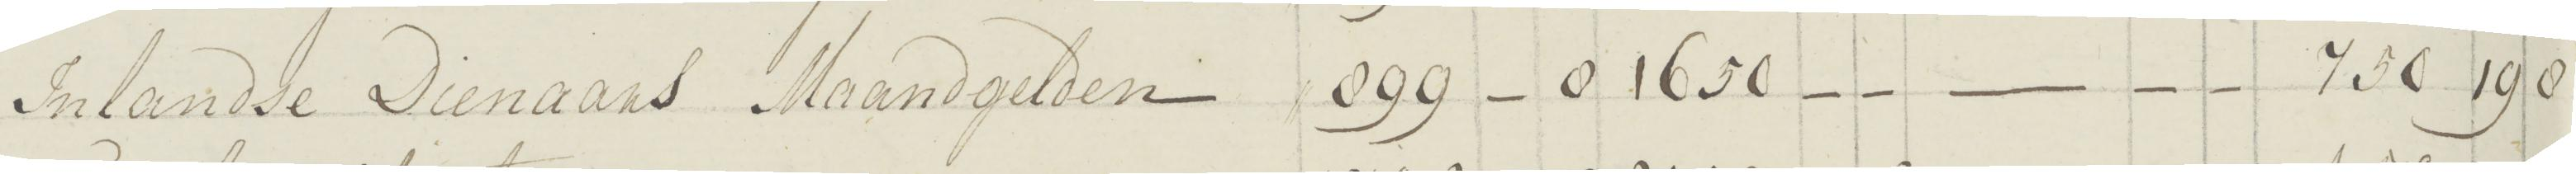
Inlandse Dienaars Maandgelden „ 899 – 8 1650 – – — – – 756 19 8
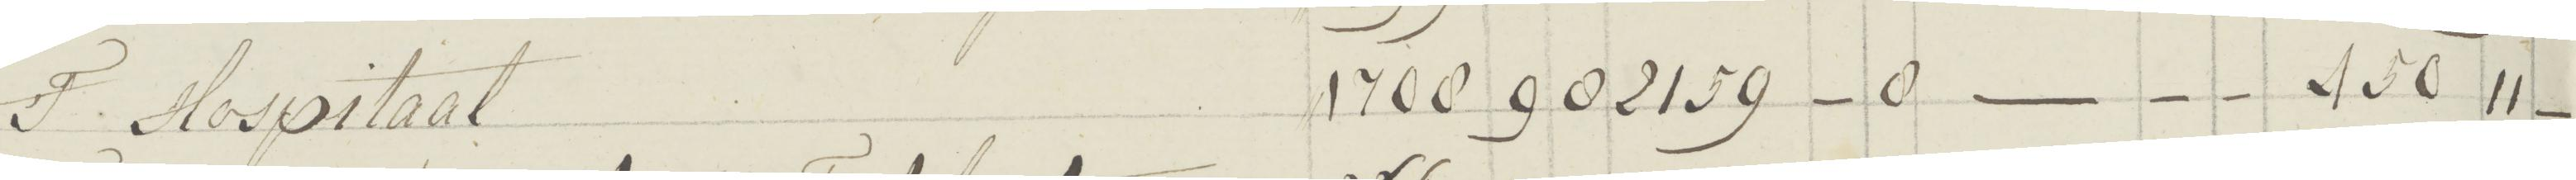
'T. Hospitaal „1708 9 8 2159 – 8 — – – 450 11 –
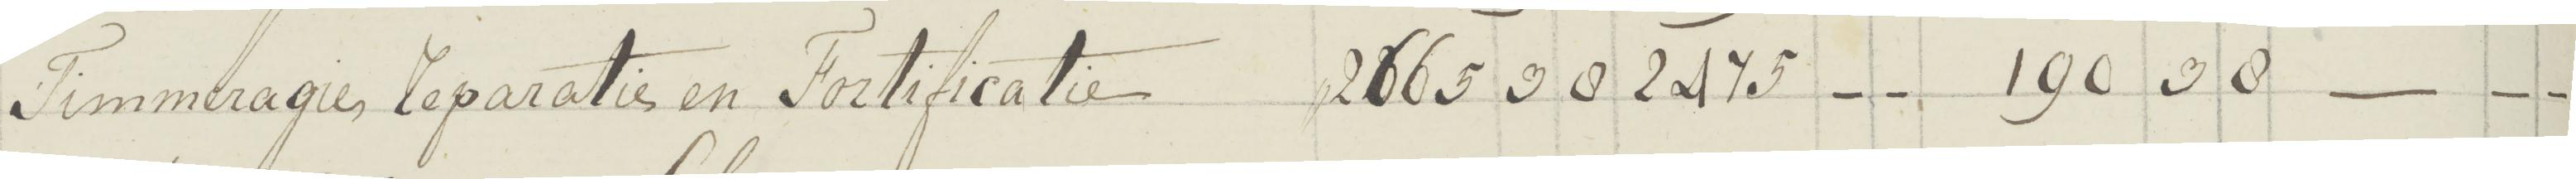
Timmeragie reparatie en Fortificatie „2665 3 8 2475 – – 190 3 8 — – –
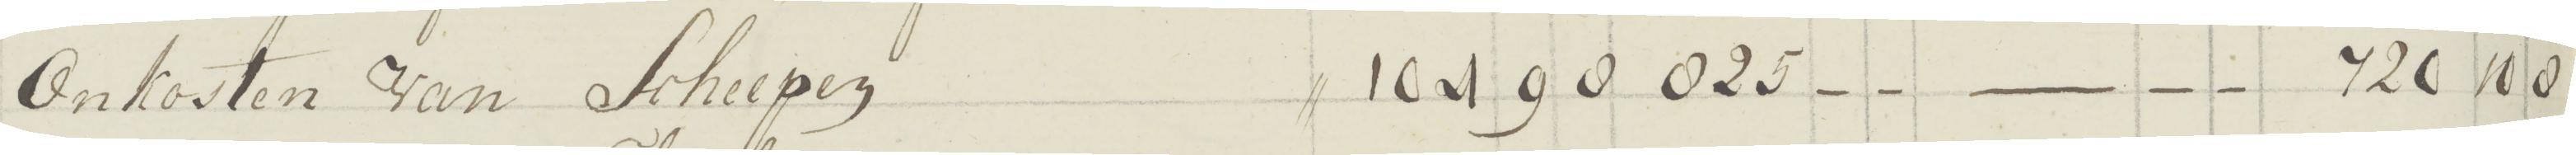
Onkosten van Scheepen „ 104 9 8 825 – – — – – 720 10 8
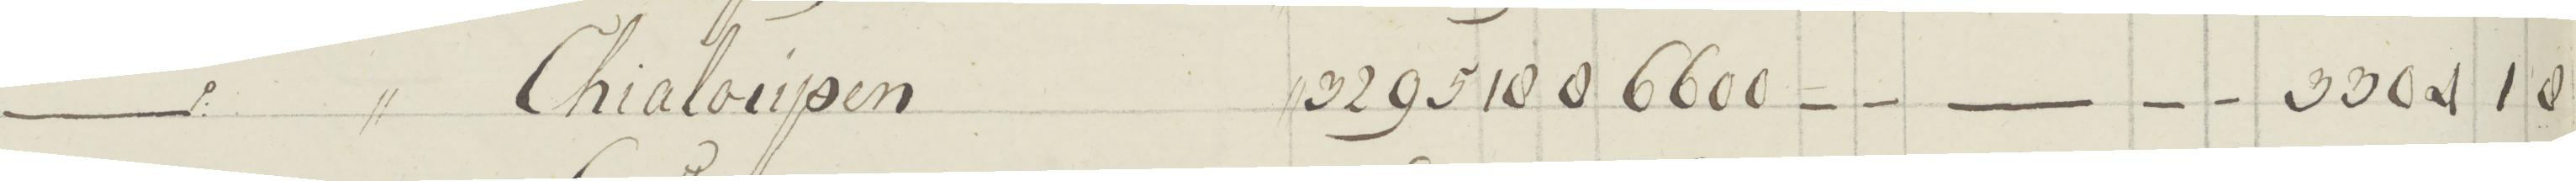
_:o „ Chialoupen „3295 18 8 6600 – – — – – 3304 1 8
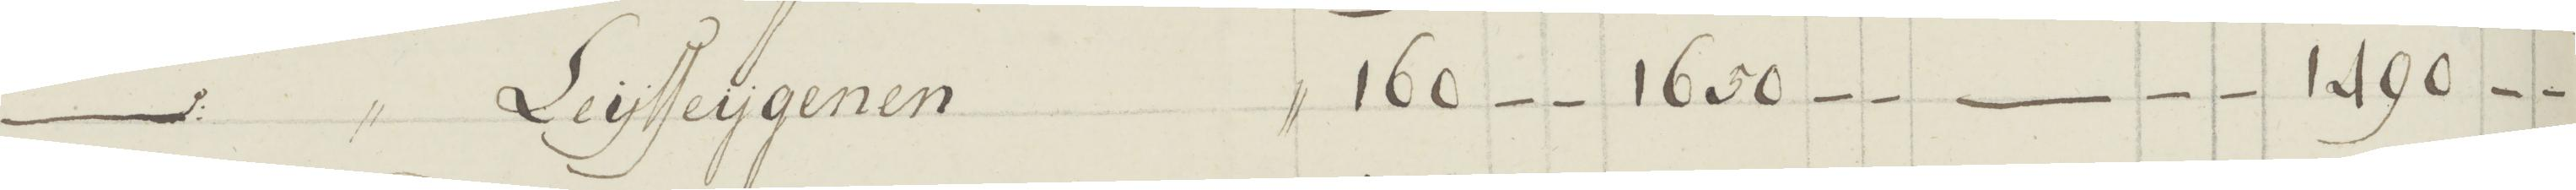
_:o „ Leijffeijgenen „ 160 – – 1650 – – — – –1490 – –
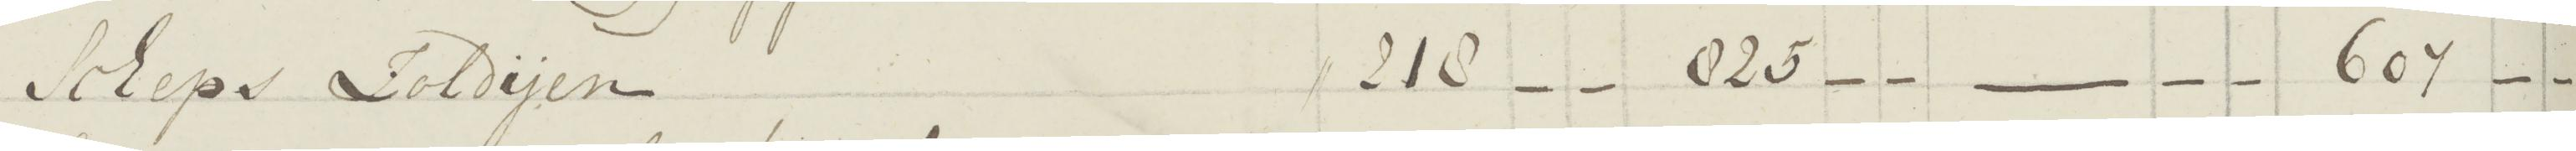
scheps zoldijen „ 218 – – 825 – – — – – 607 – –
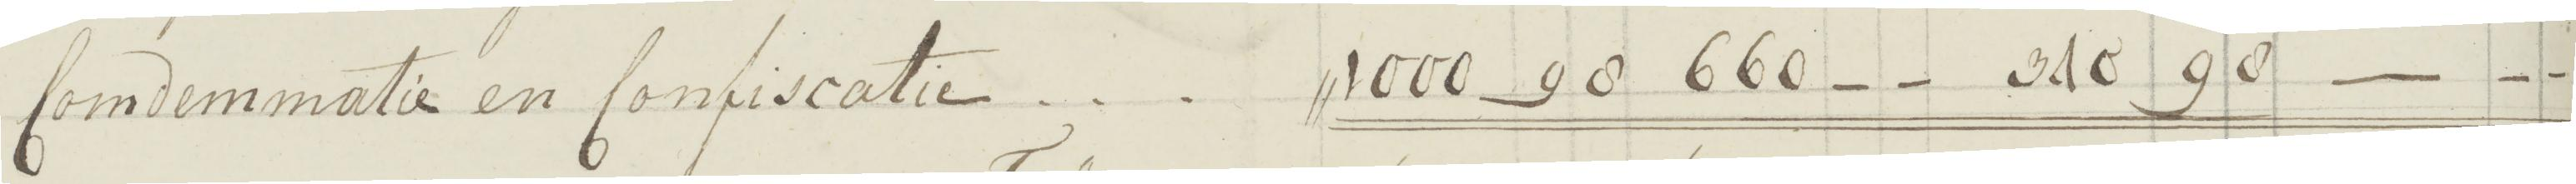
Comdemmatie en Confiscatie . . . „ 1000 9 8 660 – – 340 9 8 — – –
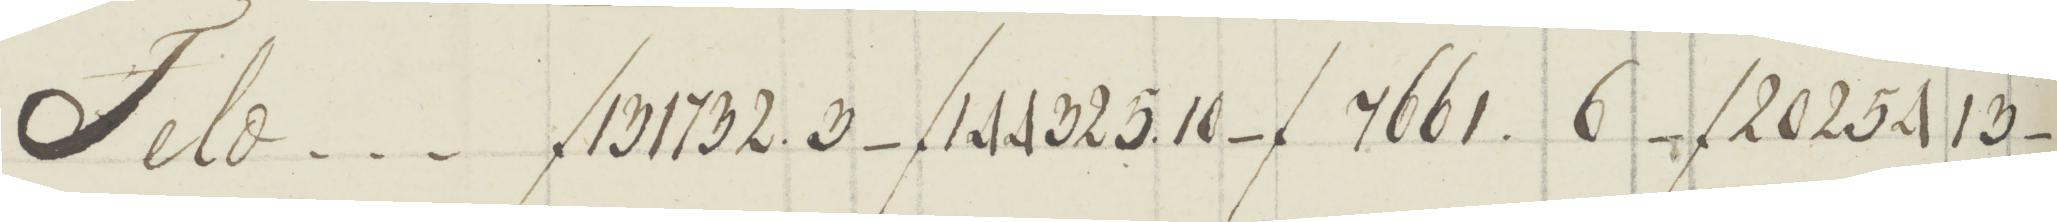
Teld - - - ƒ131732. 3 – ƒ144325. 10 –ƒ 7661. 6 – ƒ20254 13 –
